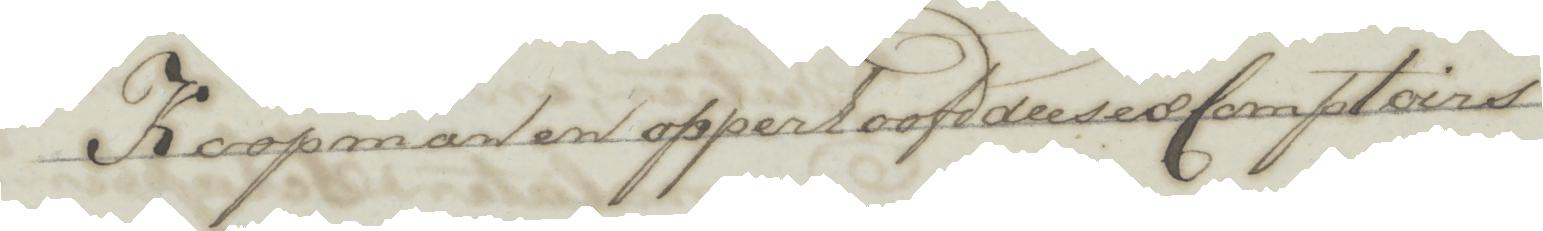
Koopman en opperhoofd deeses Comptoirs
